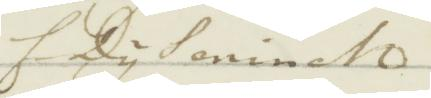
C Dijserinck
